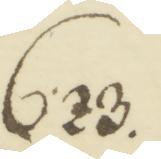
623.
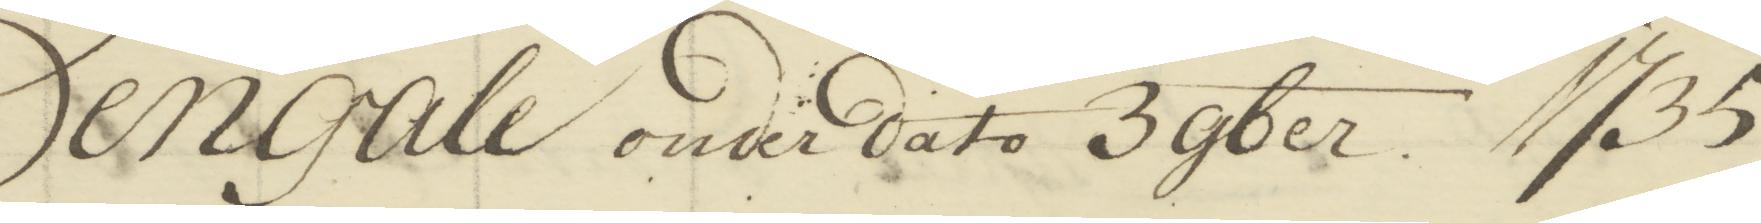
van Bengale onder dato 3 gber: 1735
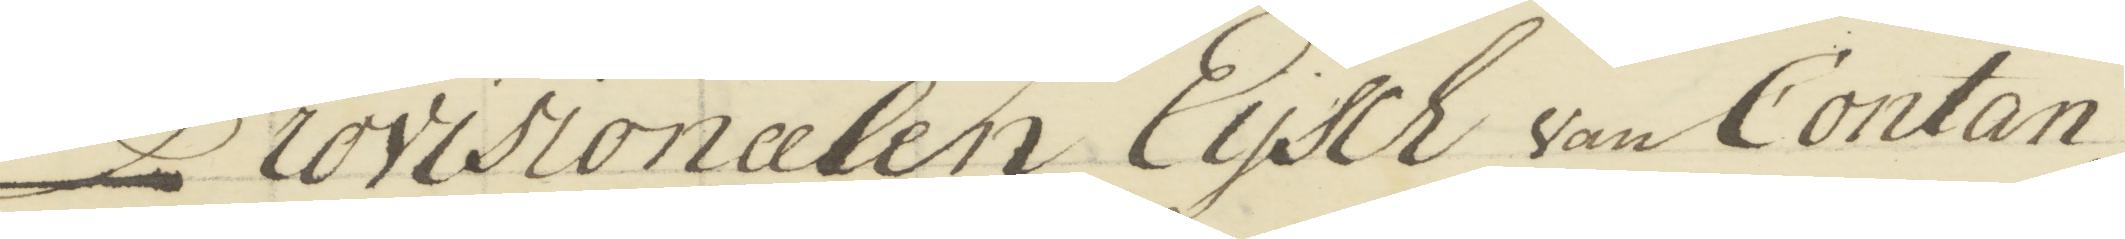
Provisioneelen Eijsch van Contan
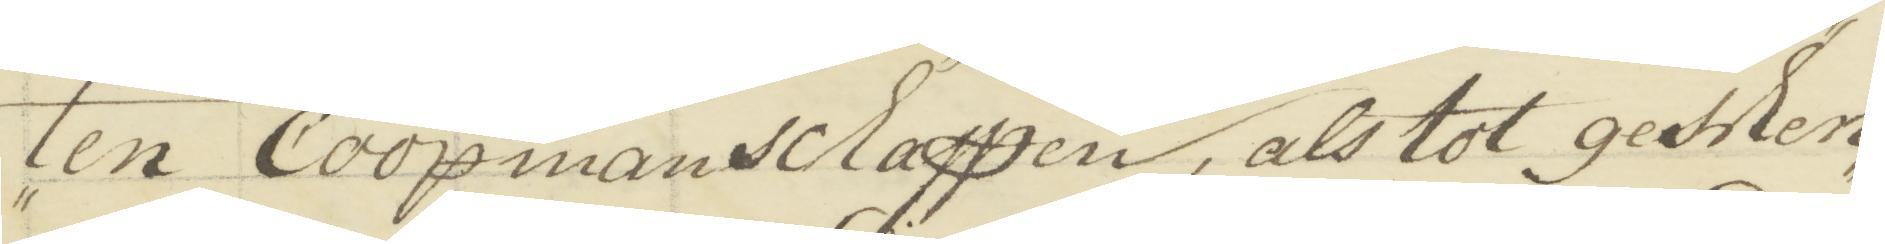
ten Coopmanschappen, als tot geschen„
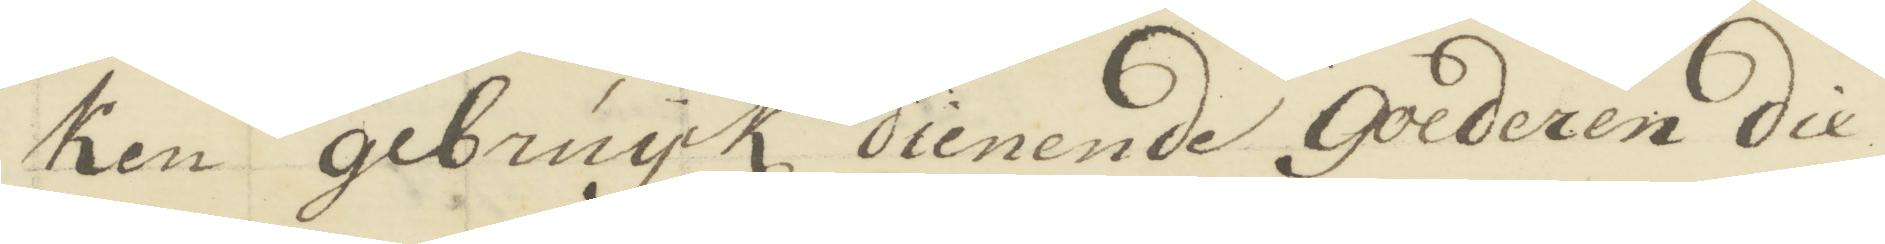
ken gebruijk dienende goederen die
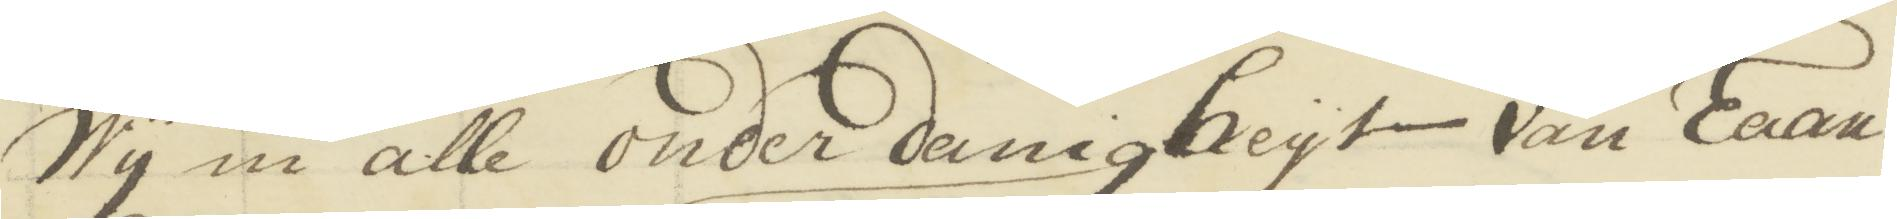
wij in alle onderdanigheijt van haar
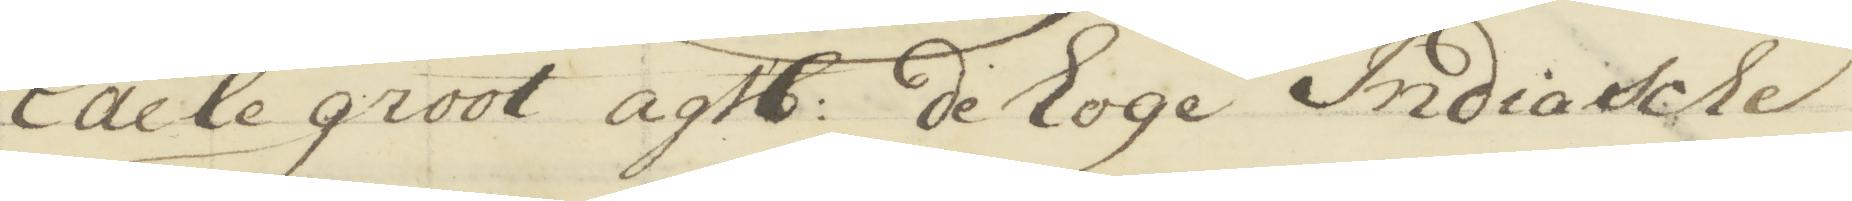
Edele groot agtb: de hoge Indiasche
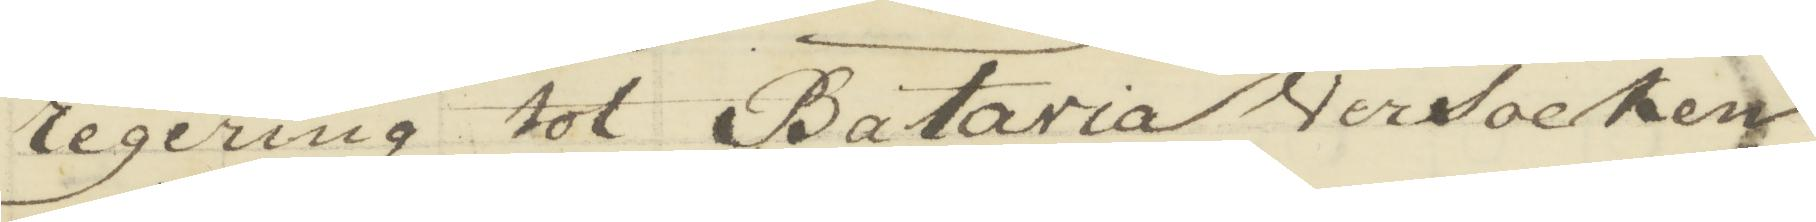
regering tot Batavia versoeken
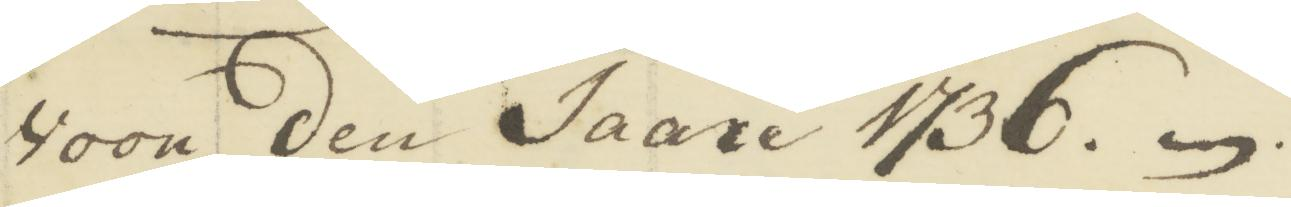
voor den Iaare 1736. —.
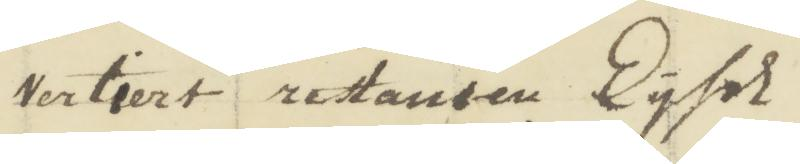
verteert restanten Eijsch
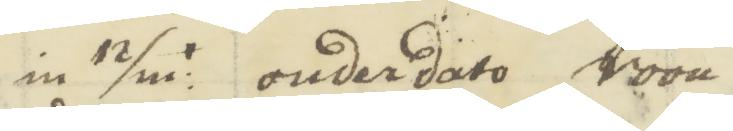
in 12/m:T onder dato voor
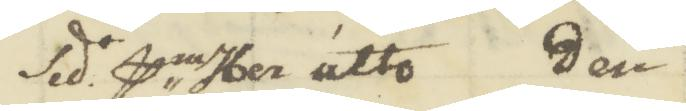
Sed:t p„m 7ber ulto den
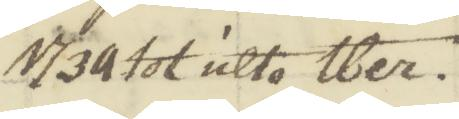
1734 tot ulto 7ber.
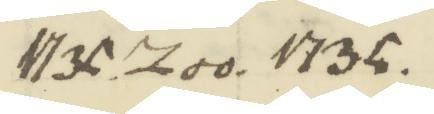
1735 Zoo. 1735.
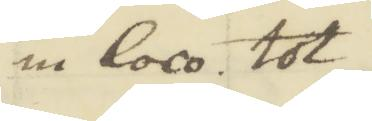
in loco. tot
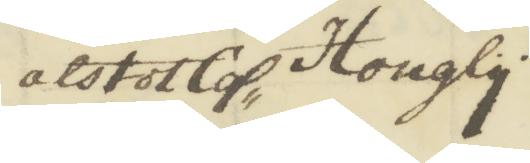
als tot Cas„ Houglij
